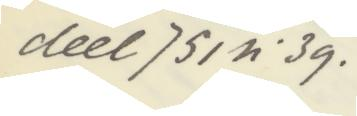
deel 751 n' 39.
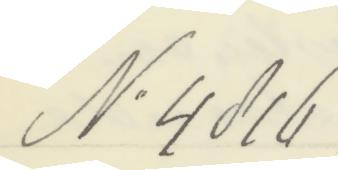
No 4814
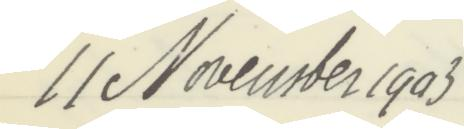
11 Novemmber 1903
